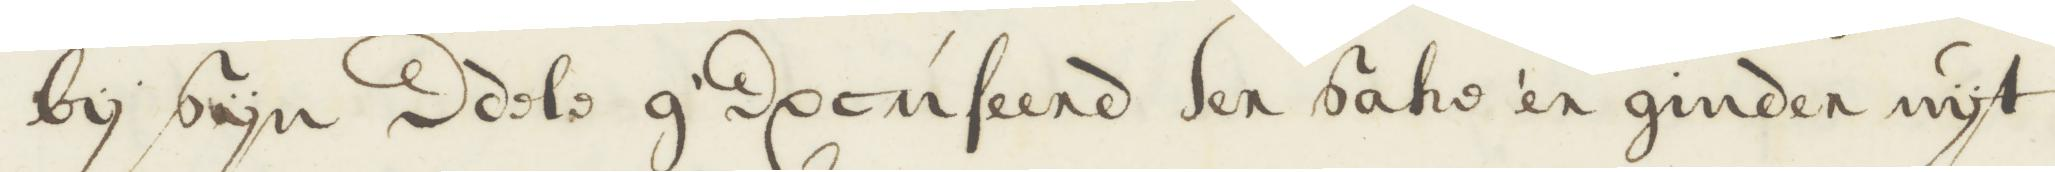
bij sijn Edele g’Excuseerd ter sake 'er ginder uijt
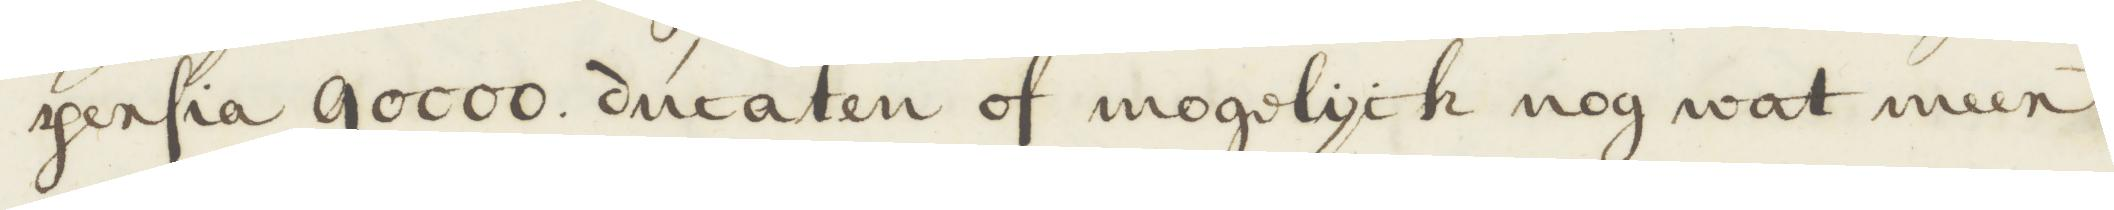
persia 40000. ducaten of mogelijck nog wat meer
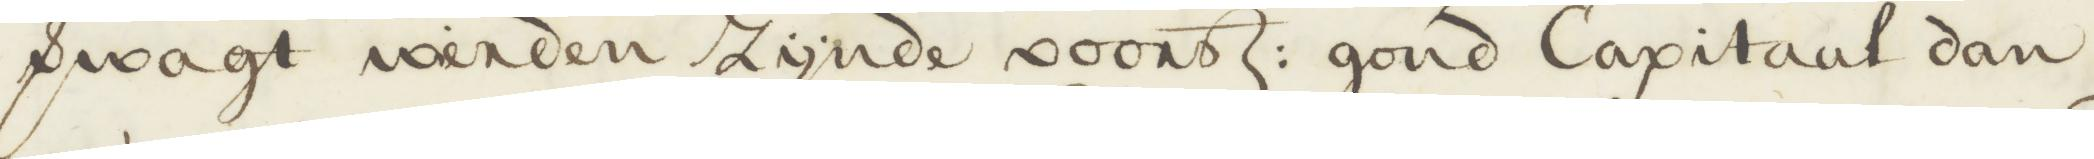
verwagt werden zijnde voorsz: goud Capitaal dan
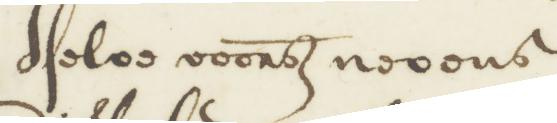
tselve voors nevens
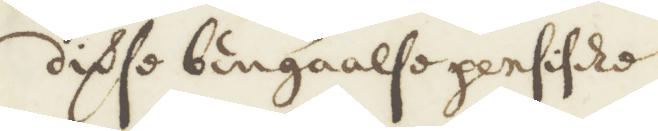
diverse bengaalse persische
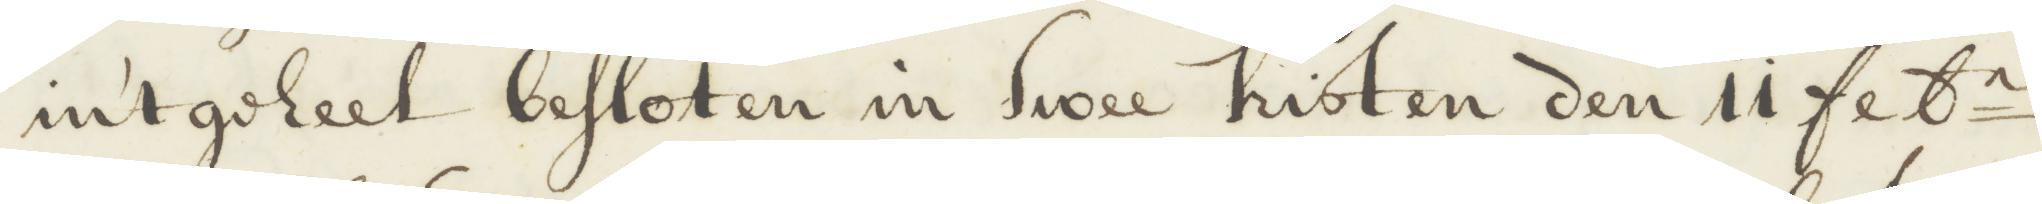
in’t geheel besloten in twee kisten den 11 feb=r
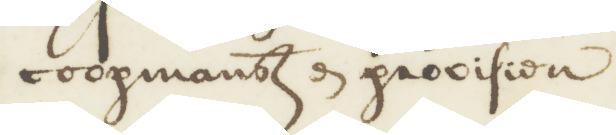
coopmansz en provisien
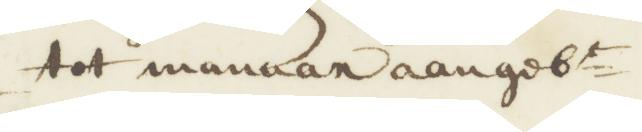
tot manaar aangeb=t
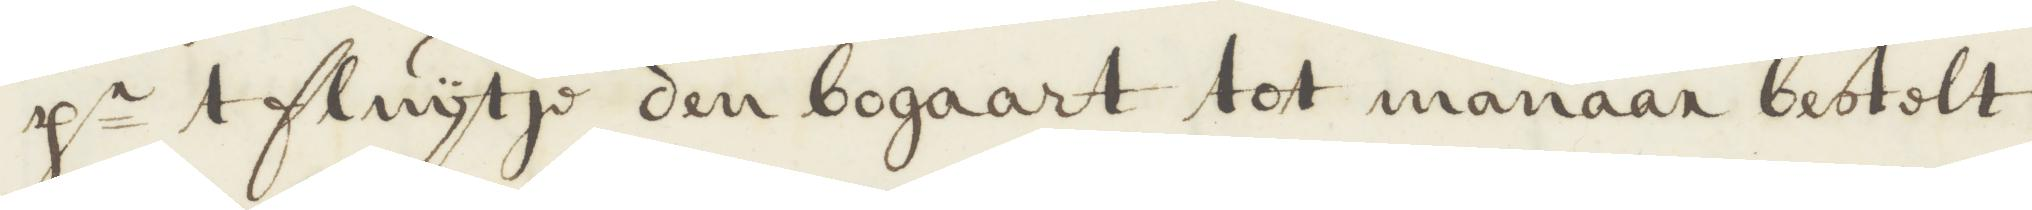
p=r 't fluijtje den bogaart tot manaar bestelt
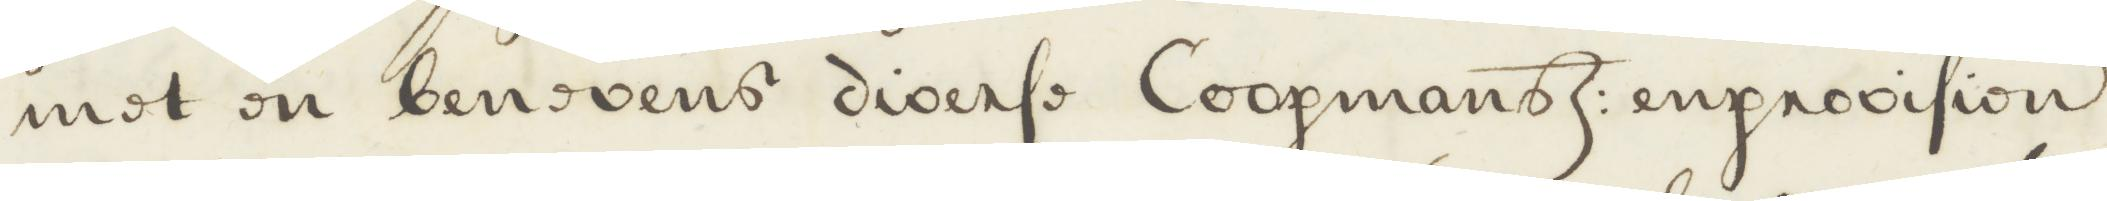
met en benevens diverse Coopmansz: en provisien
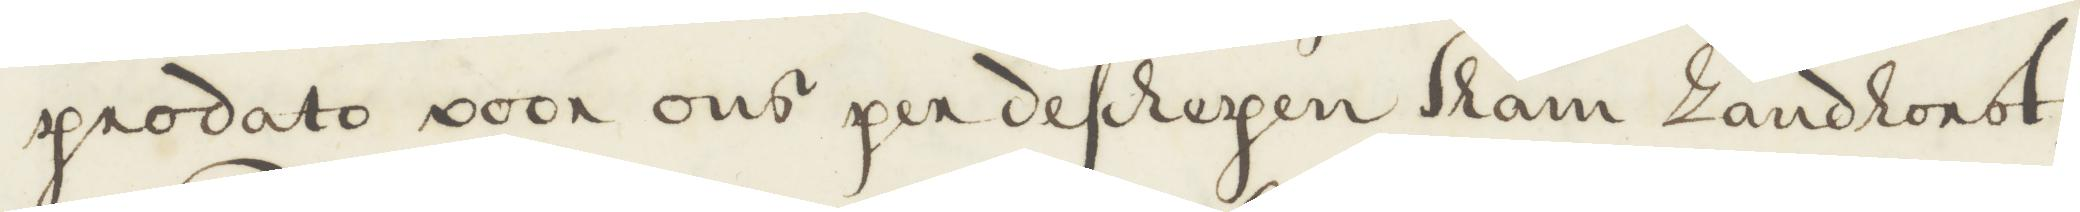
prodato voor ons per deschepen tham zandhorst
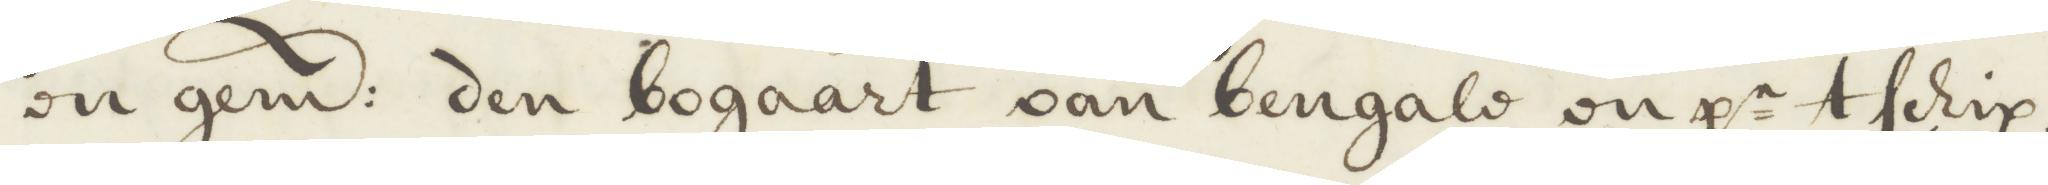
en gem: den bogaart van bengale en p=r t schip
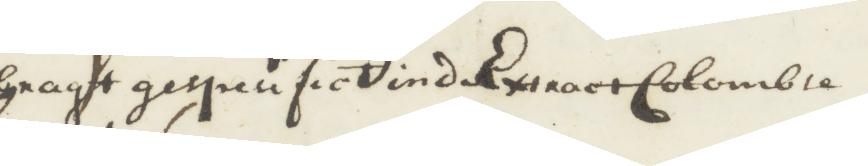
aangebragt gespecifict in de Extract Colomb te
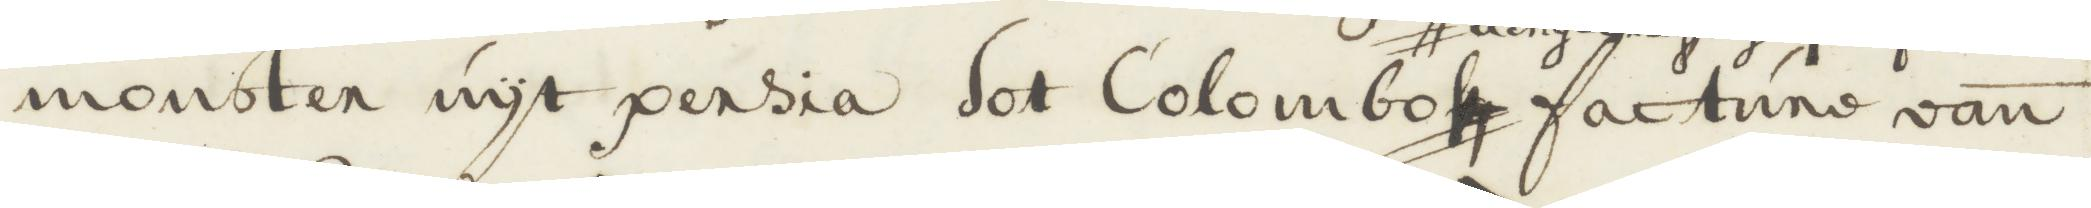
monster uijt persia tot Colombos # facture van
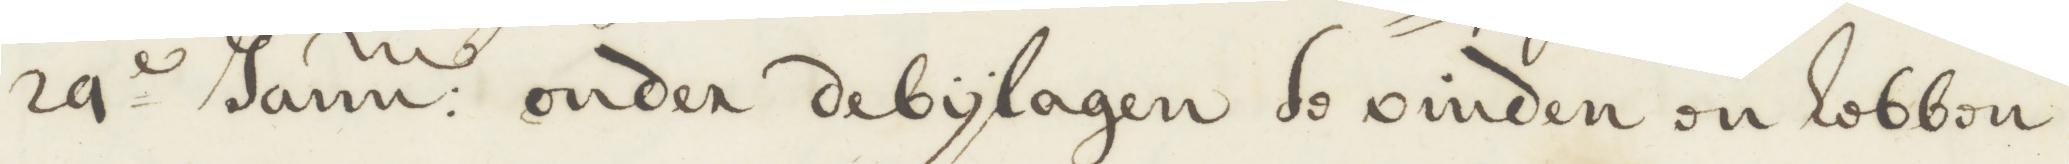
24=e Jann: onder de bijlagen te vinden en hebben
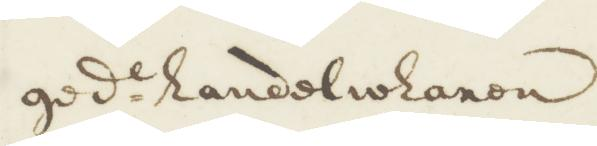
ged=e handelwharen
